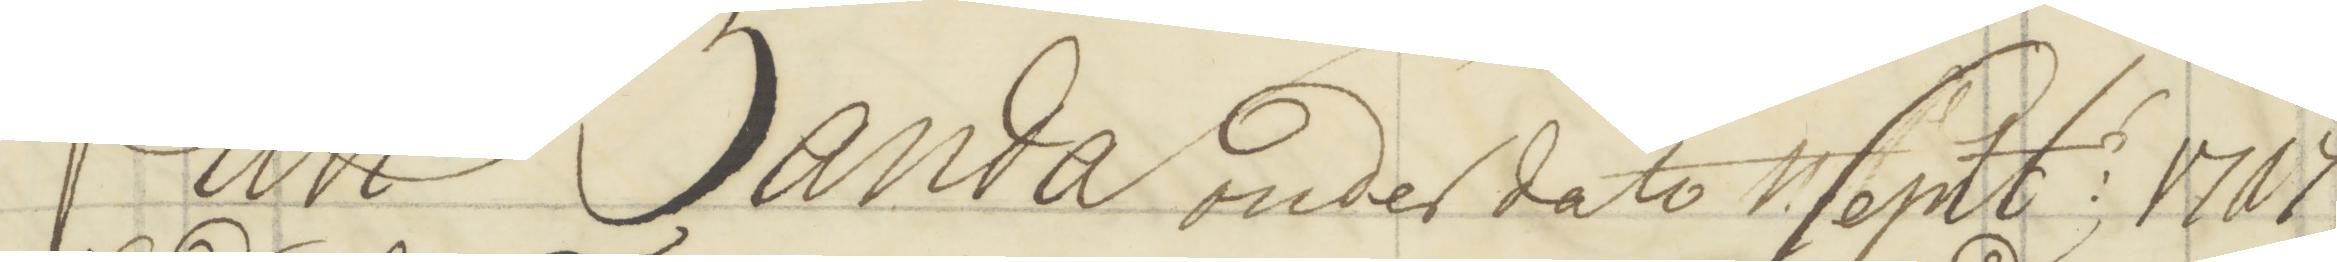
Van Banda onder dato 1. Septb:r 1747.
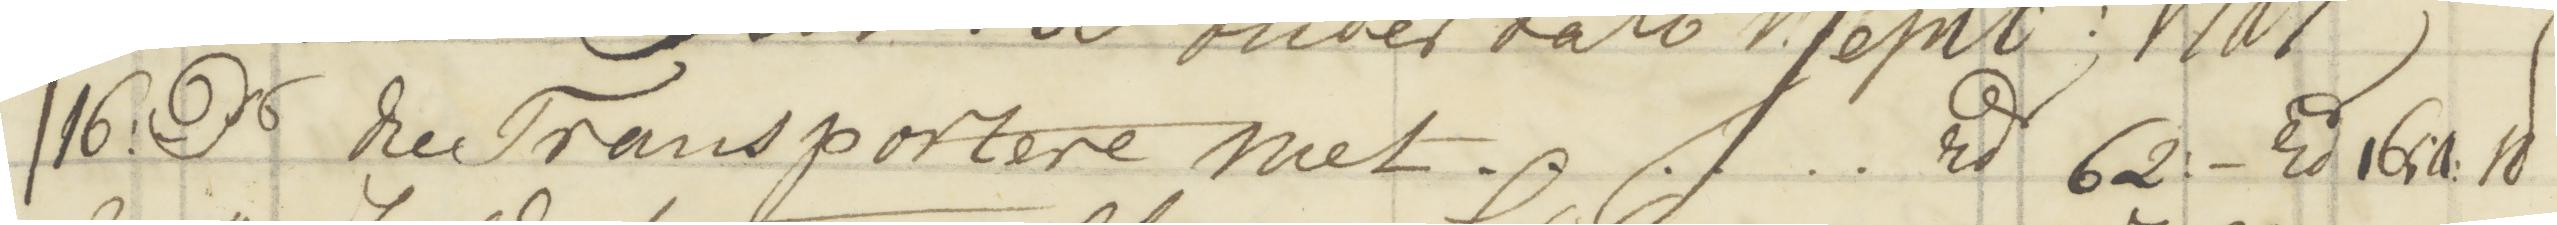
16: Ps die Transportere met . . . . . . rds 62:— rds 1654. 18
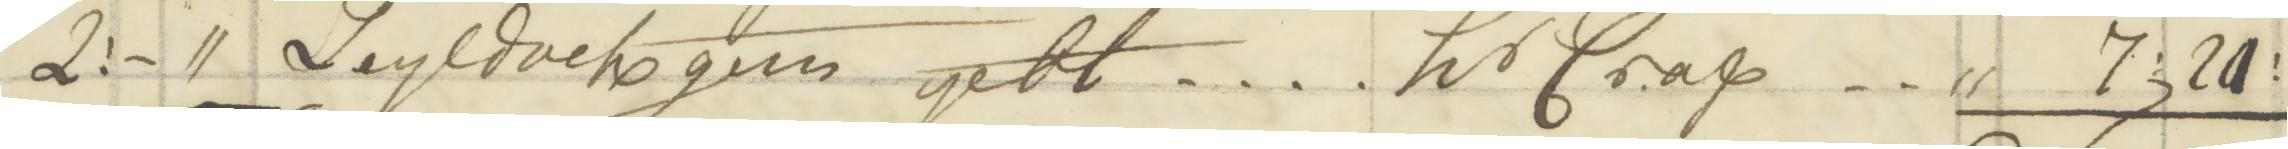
2:– „ Zeyldoek gem gebt . . . . hr Crap - - „ 7: 24:
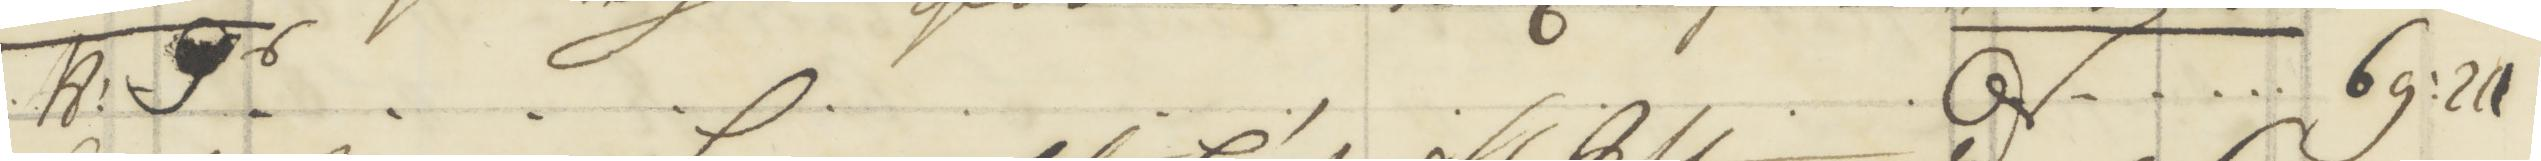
18: Ps . . . . . . . . . . . . . . . . . . 69:24
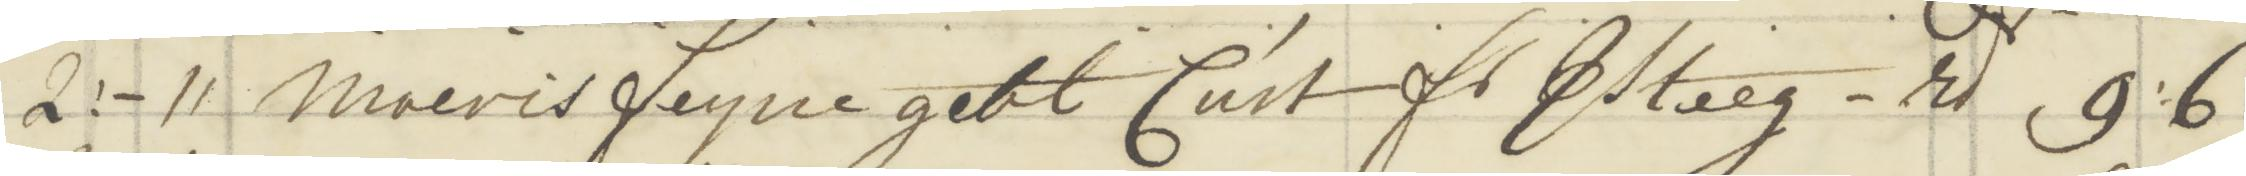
2:- „ moeris feyne gebl Cust fs versteeg -. rds 9:6
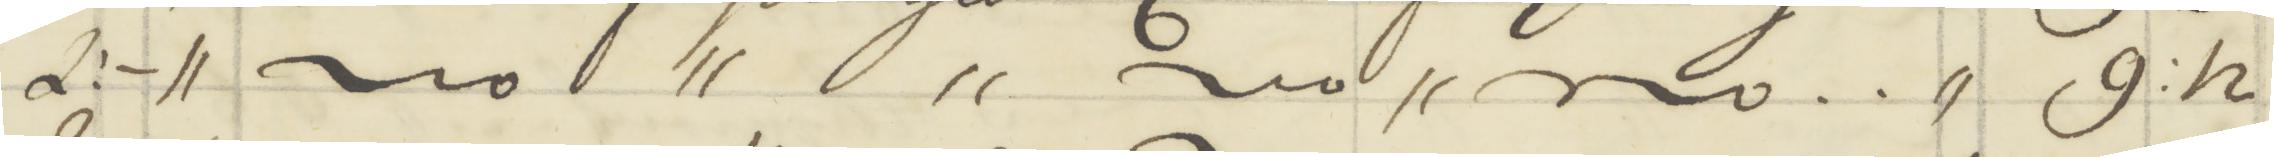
2:- „ _o „ „ _o „ _o . . „ 9:12
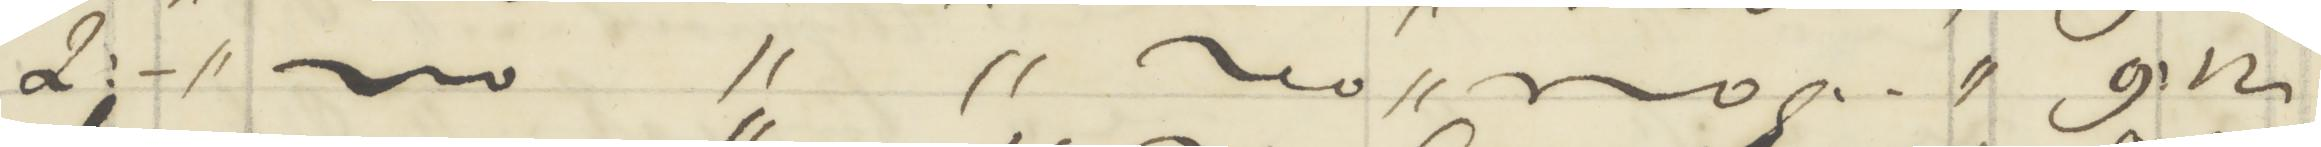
2:- „ _o „ „ _o„ _o „ . . 9:12
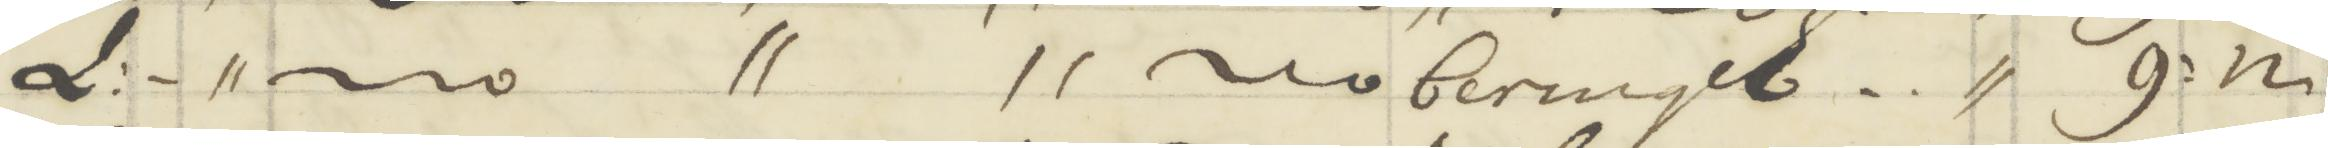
2:- „ _o „ „ do„ beringh . . „ 9: 12
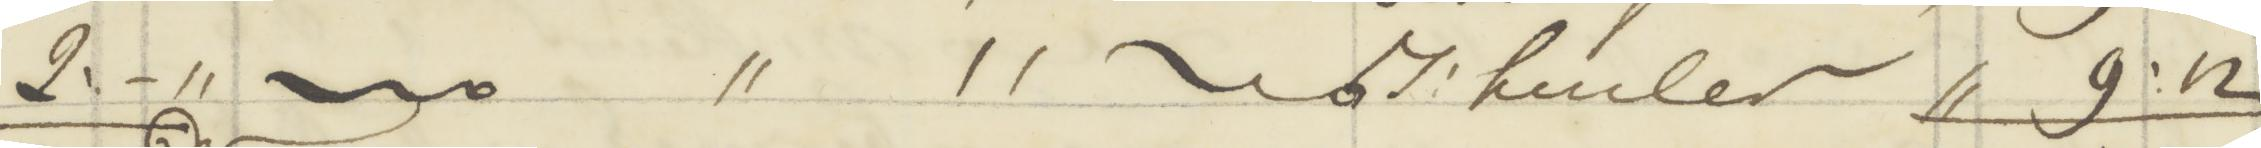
2:- „ _o „ „ _o I: kinler „ 9:12
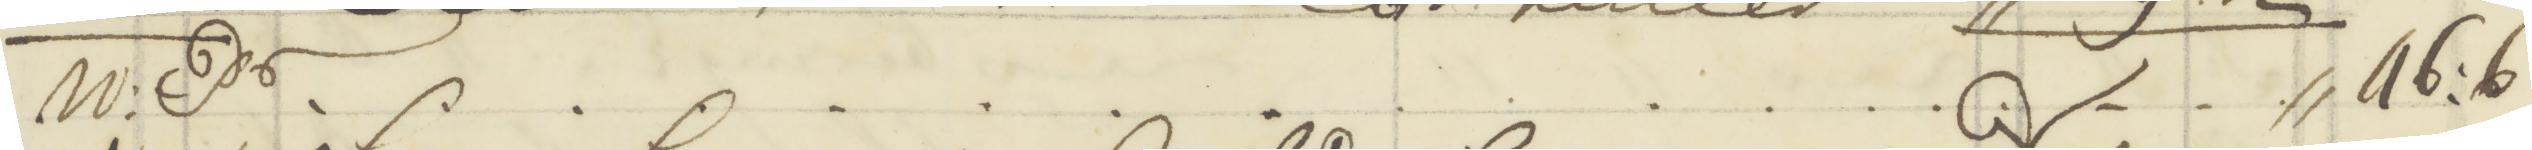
10: Ps . . . . . . . . . . . . . . . . . „ 46:6
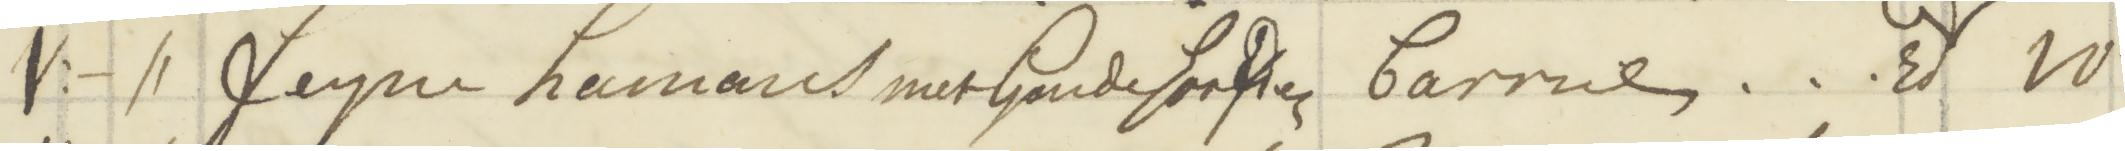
1 „ feyne hamans met Goude hoofden barriel . . . rds 10:
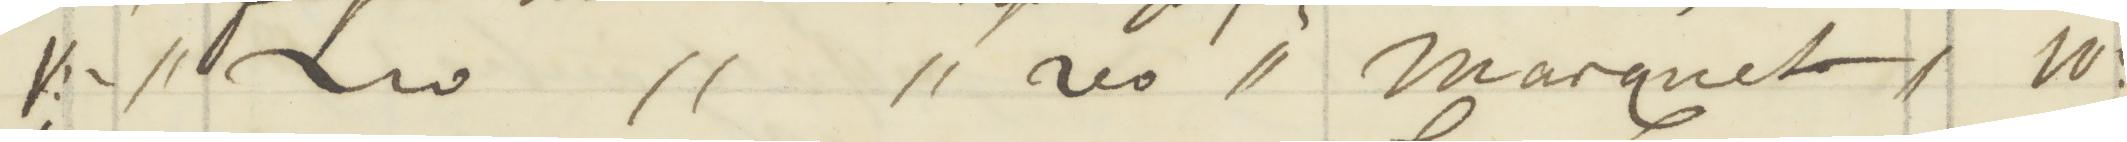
1:- „ _o „ „ _o „ Marquet „ 10
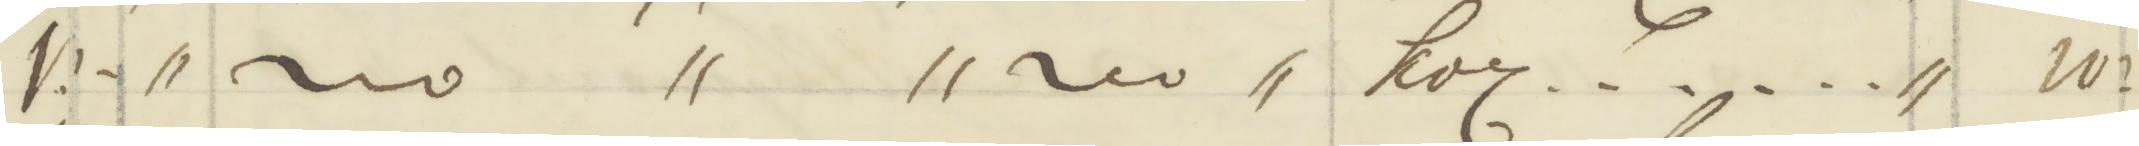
1:- „_o „ „ _o „ kox - - - - - „ 10:
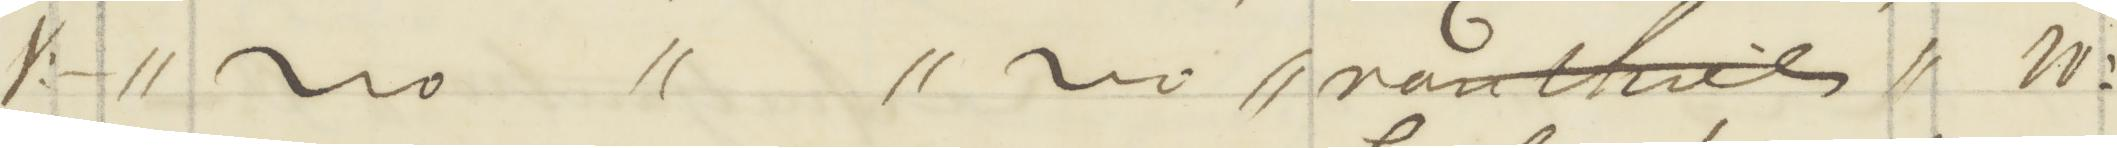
1:- „ _o „ _o „ van thiel „ 10:
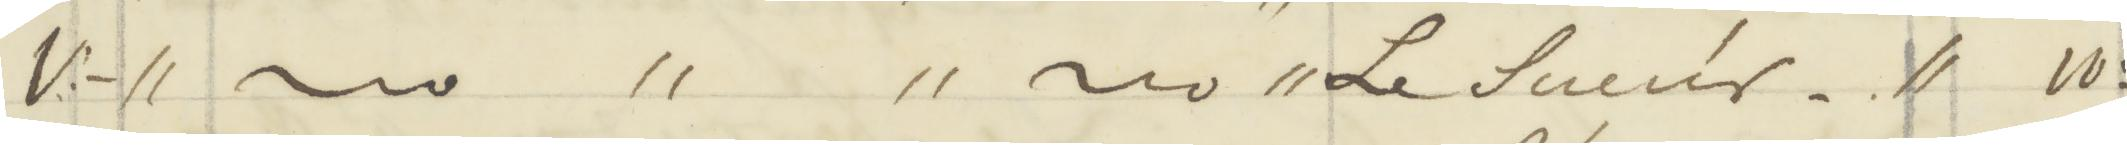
1:- „ _o „ „ _o„ Le sueur - „ 10
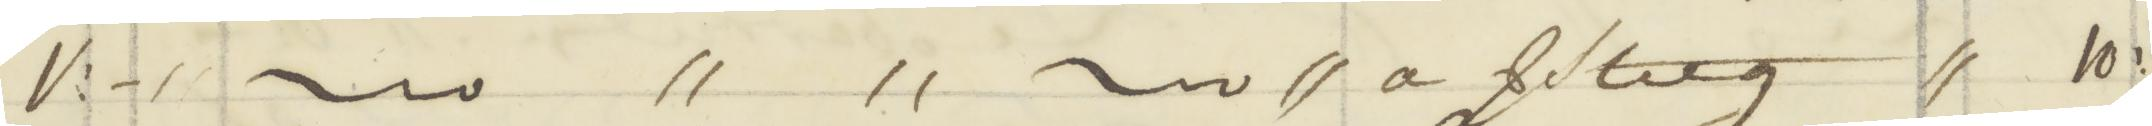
1:- „ _o „ „ _o „ a versteeg „ 10
